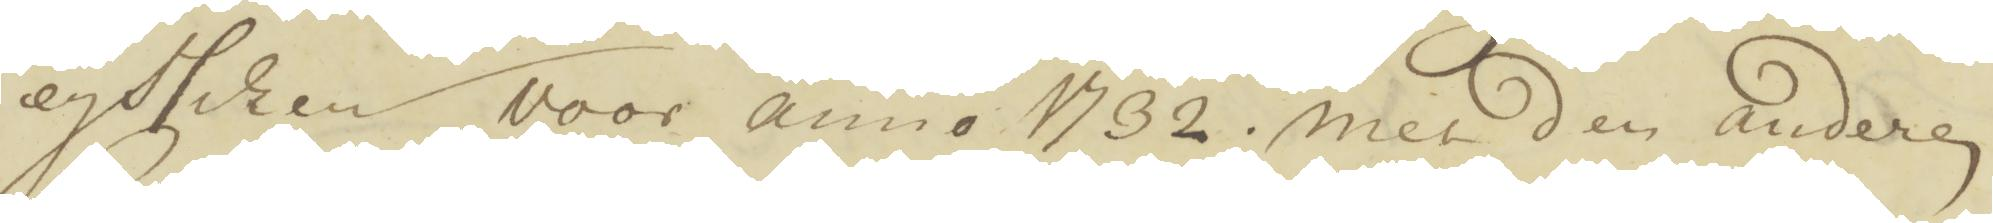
eysschen voor anno 1732. met den anderen
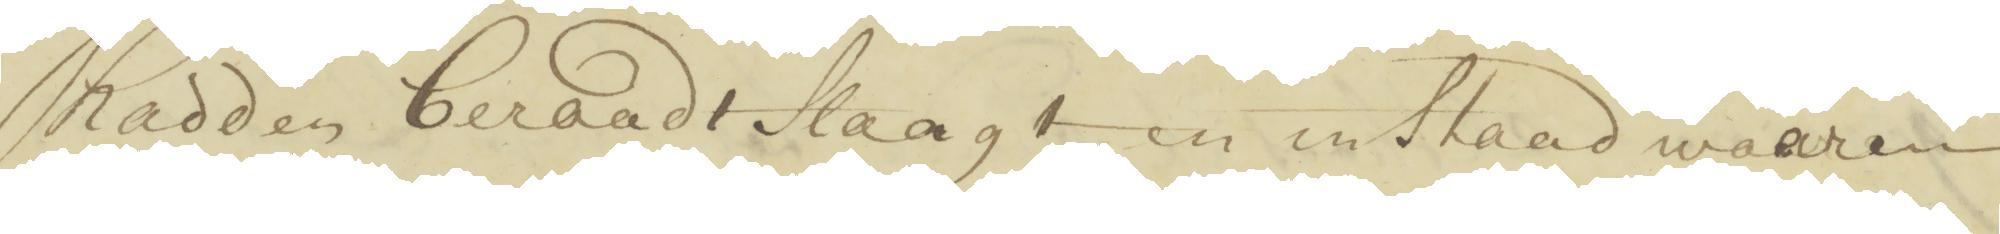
hadden beraadtslaagt en instaad waaren
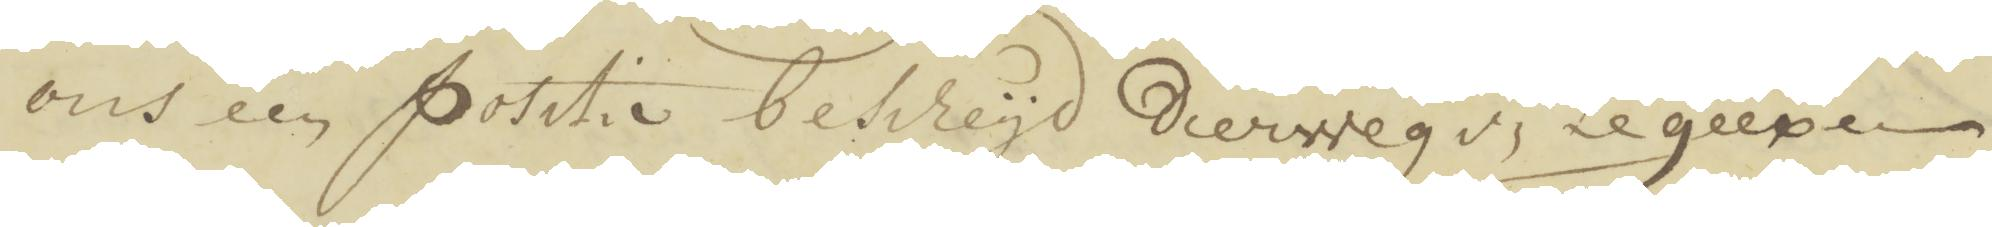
ons een positie bescheijd dierwegen te geeven
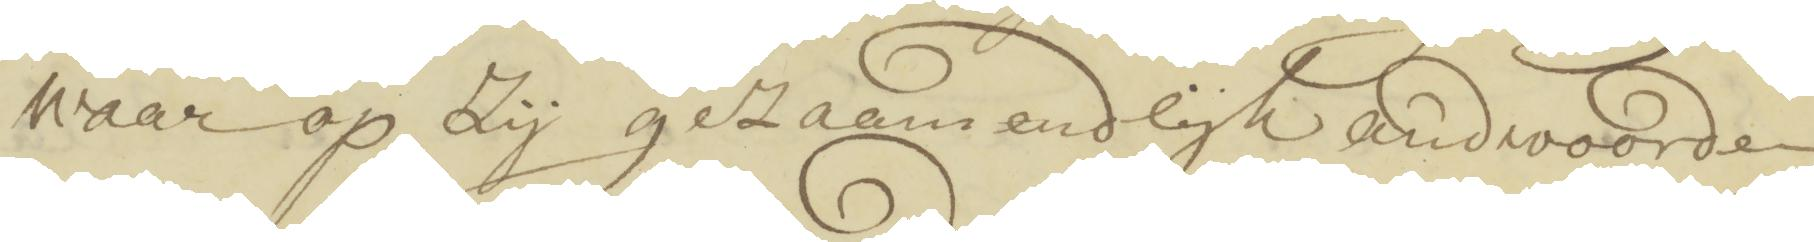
waar op zij gezaamendlijk andwoorden
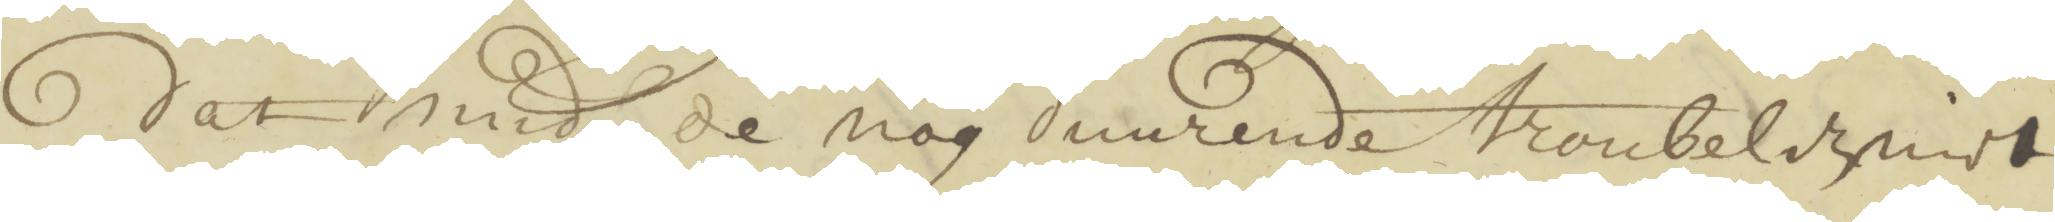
dat mids de nog duurende troubelen niet
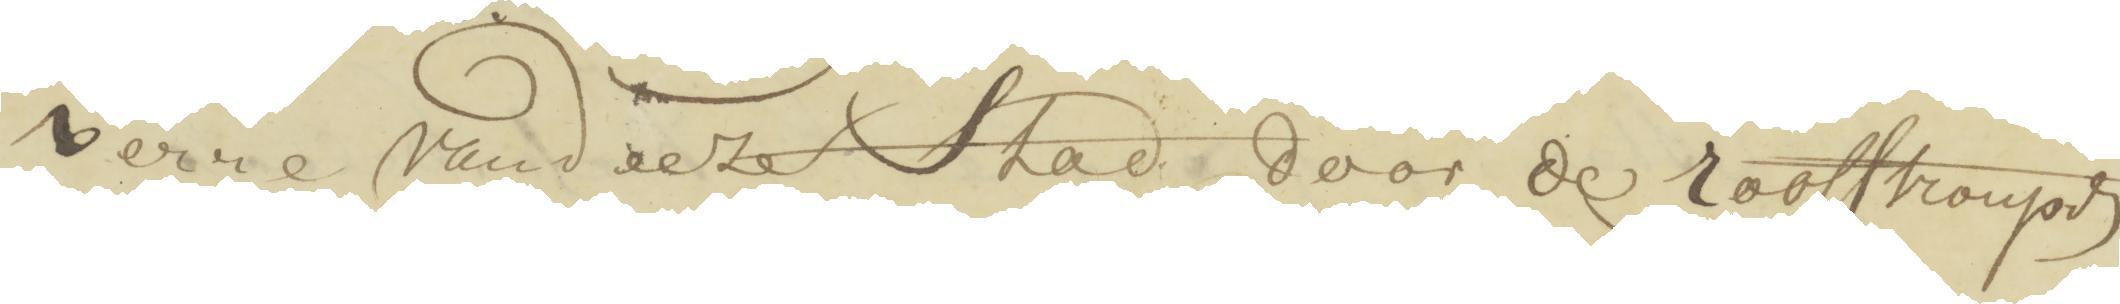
verre van deeze Stad door de roofftroupen
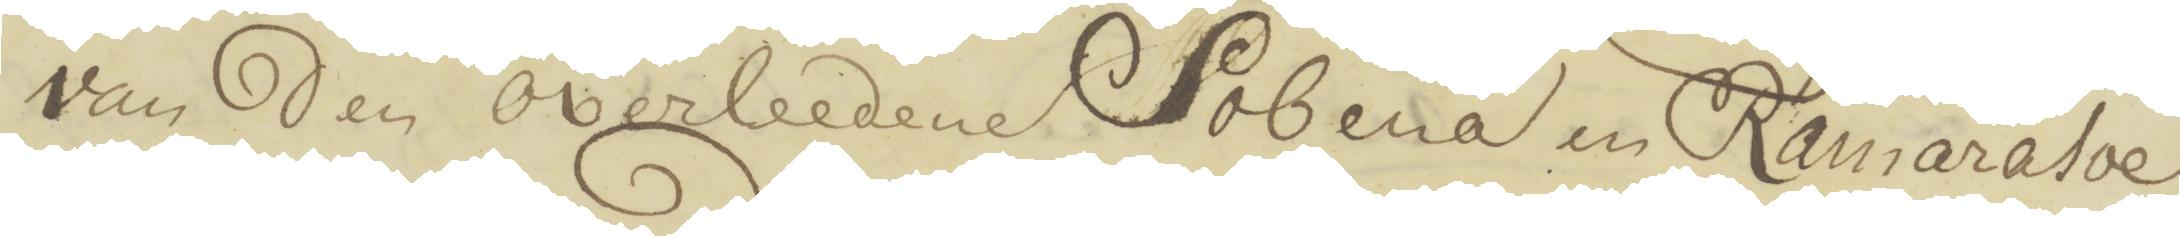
van den overleedene Sobena en Ramarasoe
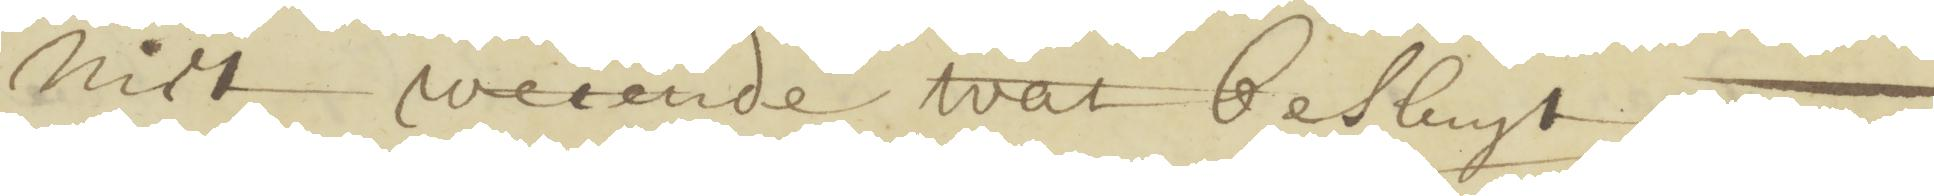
niet wetende wat besluijt gem:
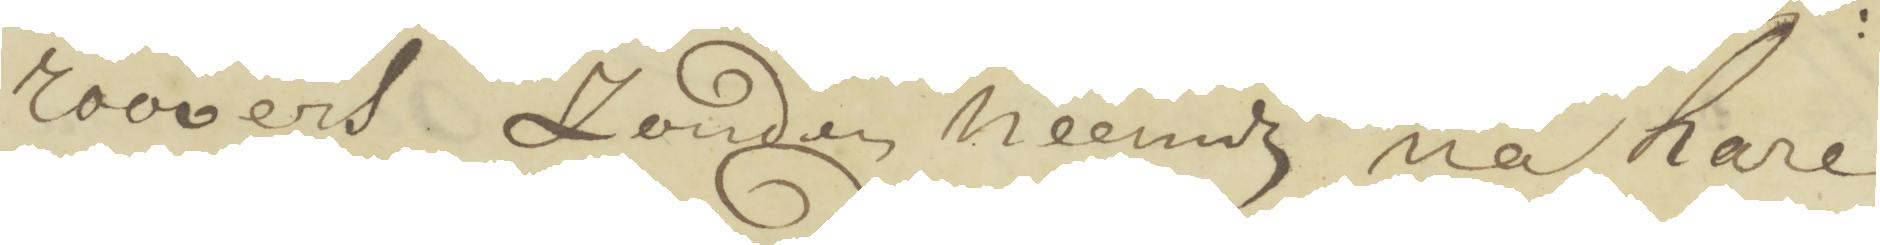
roovers zouden neemen na hare
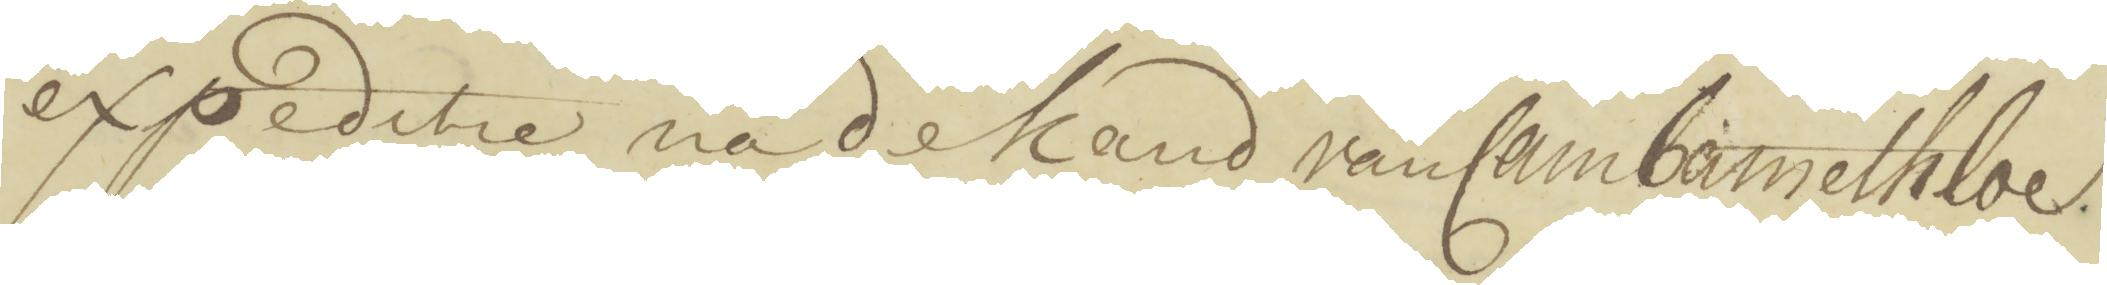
expeditie na de kand van Cambamethloe.
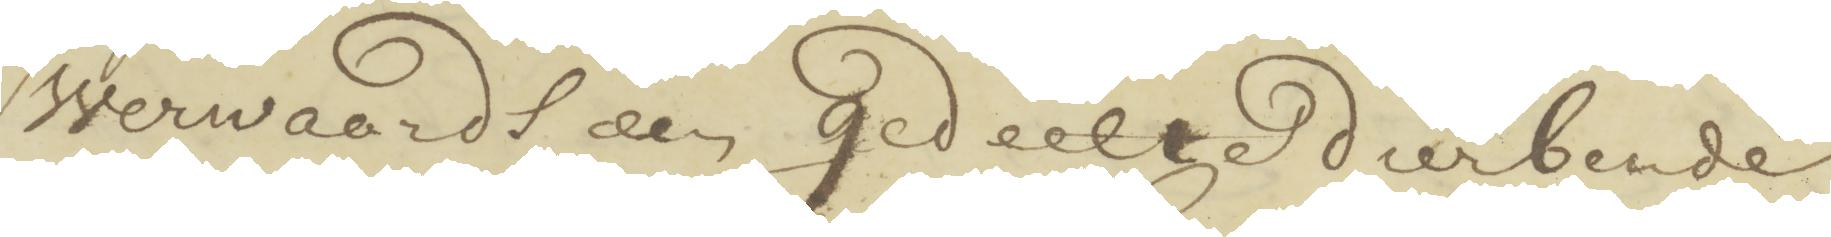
werwaards een gedeelte dier bende
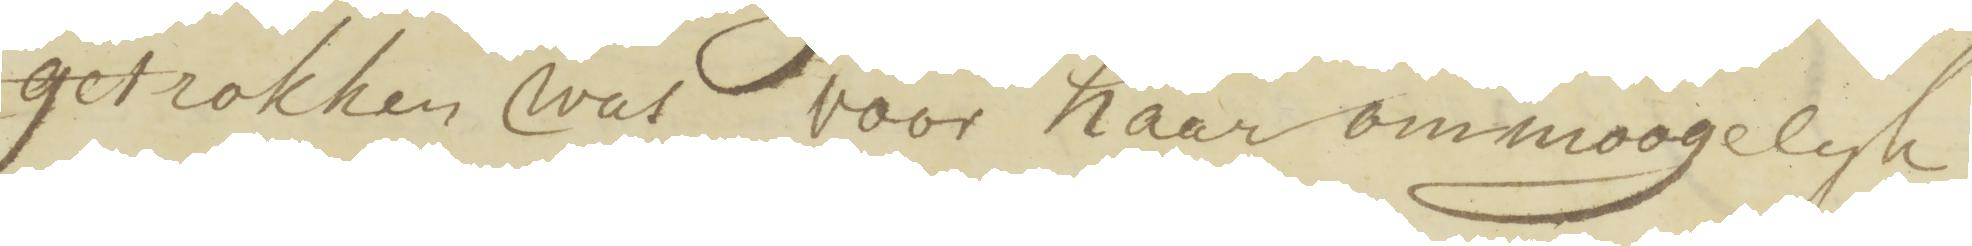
getrokken was voor haar om moogelyk
